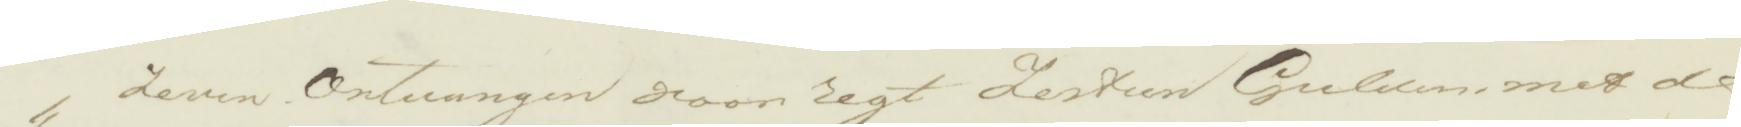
„ zeven Ontvangen voor regt Zestien Gulden, met de
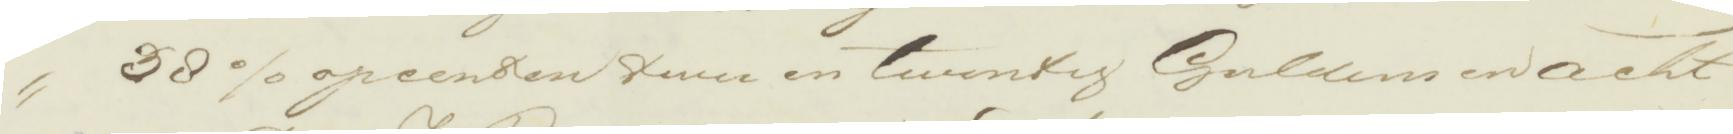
„ 38% opcenten twee en twintig Guldens en acht
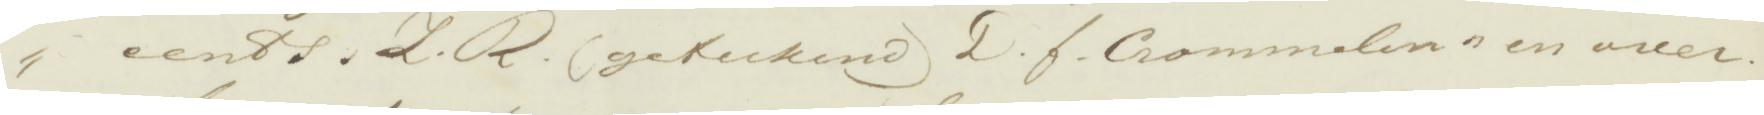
„ cents: Z.R. (geteekend) D.f. Crommelin" en over
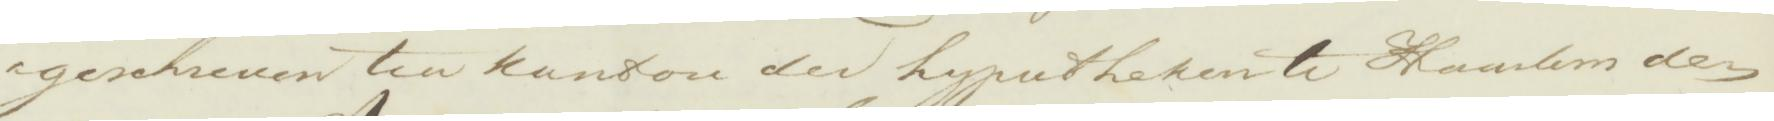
geschreven ten kantore der hypotheken te Haarlem den
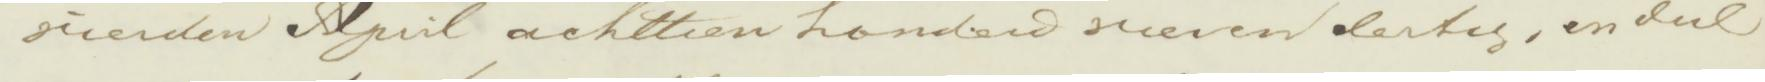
vierden April achttien honderd vier en dertig, en deel
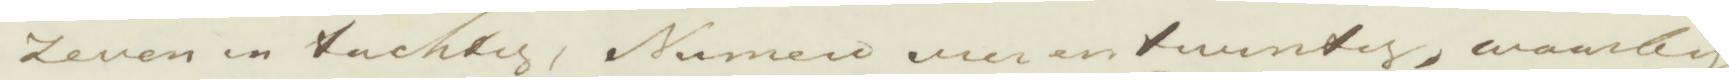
zeven en tachtig, Numero vier en twintig, waarby
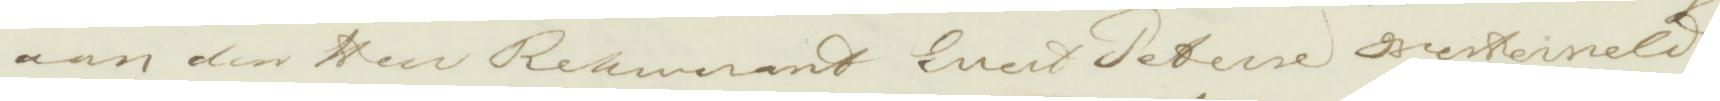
aan den Heer Rekwirant Evert Peterse Westerveld
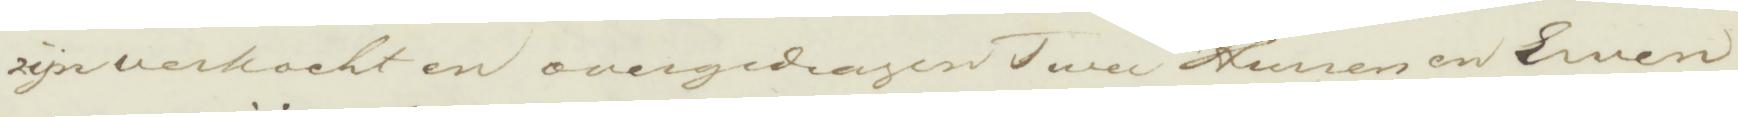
zijn verkocht en overgedragen Twee Huizen en Erven
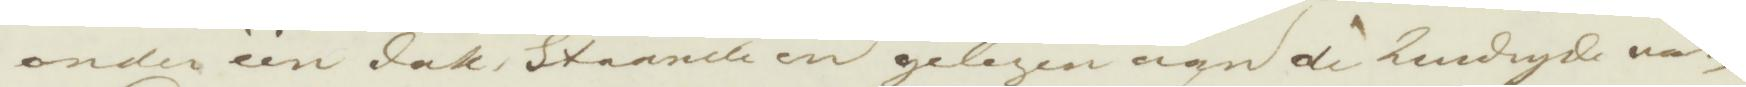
onder één dak, staande en gelegen aan de Zuidzyde van
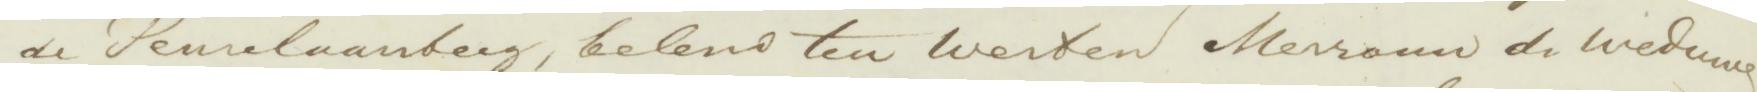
de Peuzelaarsteeg, belend ten westen Mevrouw de weduwe
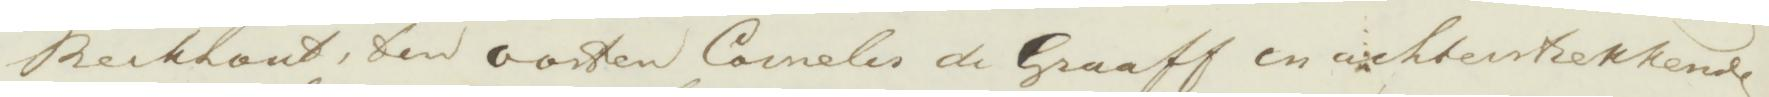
Reckhout, ten oosten Cornelis de Graaff en achterstrekkende
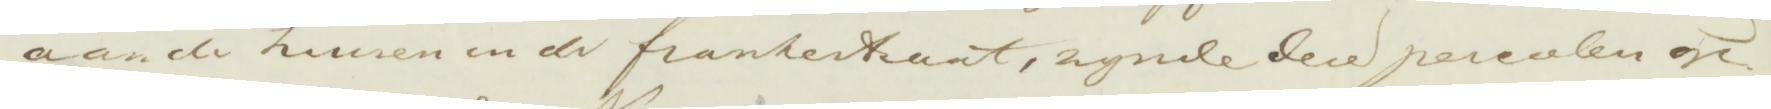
aan de huizen in de frankestraat, zynde deze perceelen ge
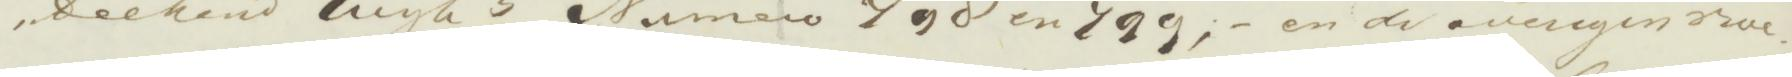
„teekend wyk 3 Numero 798 en 799; - en de overigen vroe
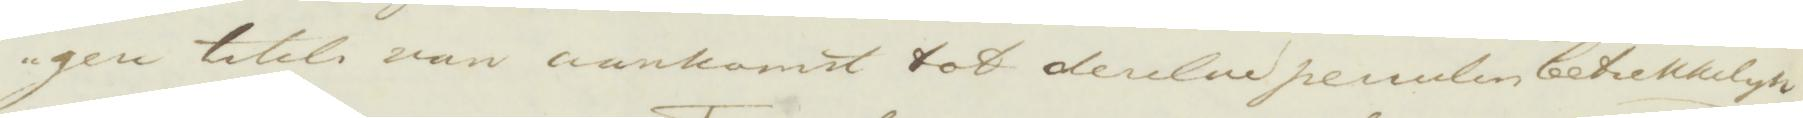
„gere titels van aankomst tot dezelve perceelen betrekkelyk
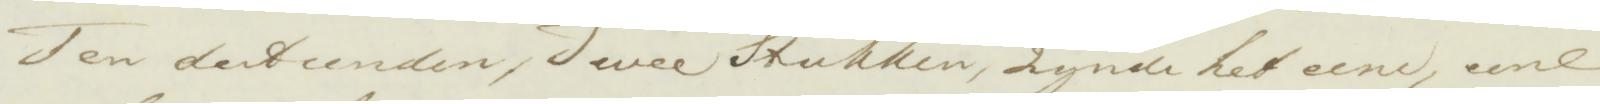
Ten dertienden, Twee stukken, zynde het eene, eene
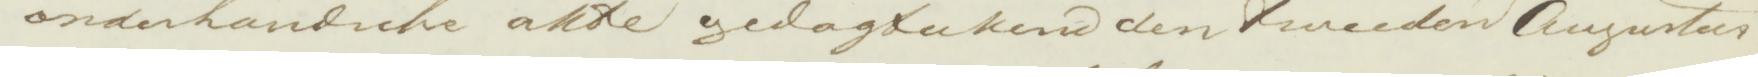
onderhandsche akte gedagteekend den tweeden Augustus
